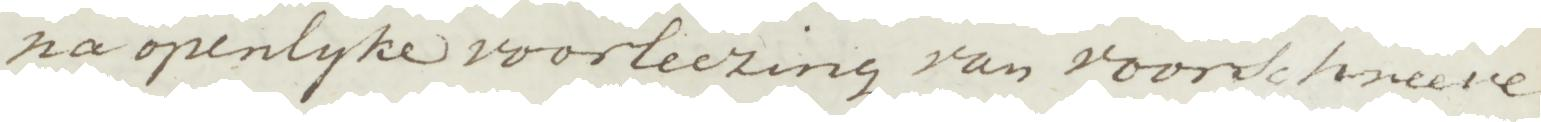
na openlyke voorleezing van voorschreeve
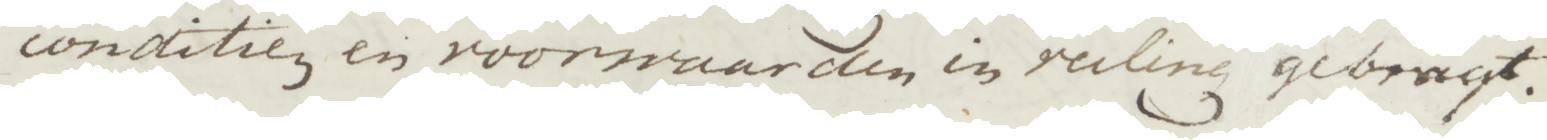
conditien en voorwaarden in veiling gebragt.
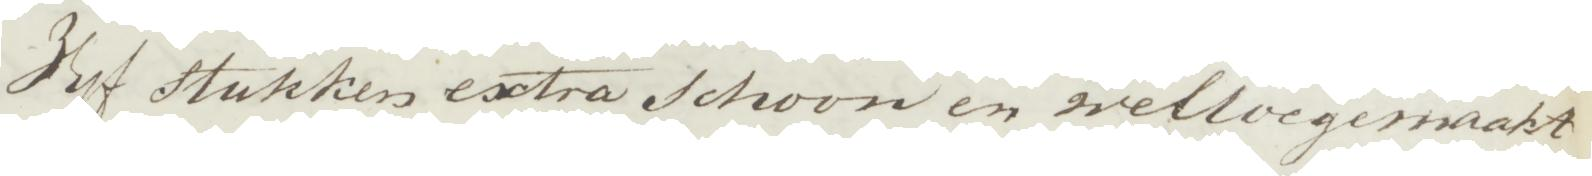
Vyf stukken extra schoon en weltoegemaakt
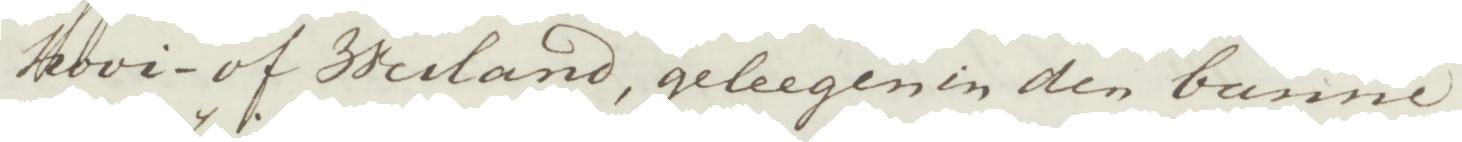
hooi- of Weiland, geleegen in den banne
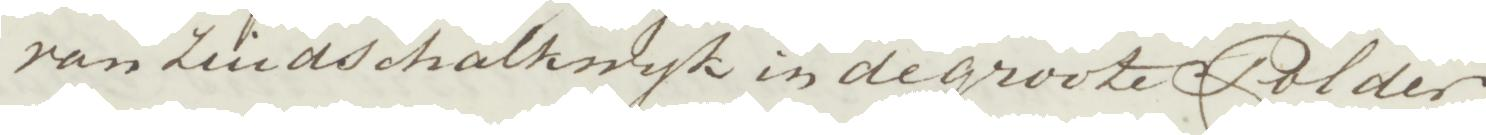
van zuidschalkwyk in de groote Polder
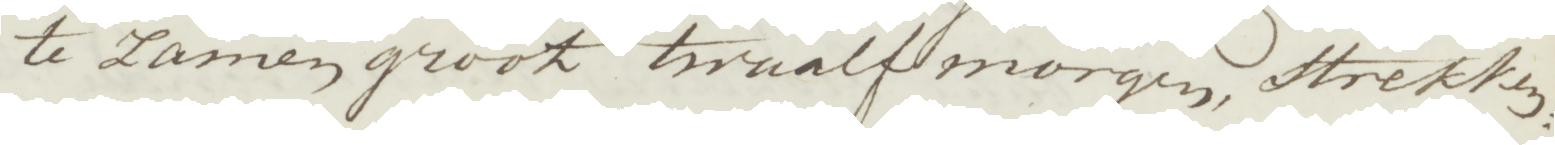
te zamen groot twaalf morgen, strekken:
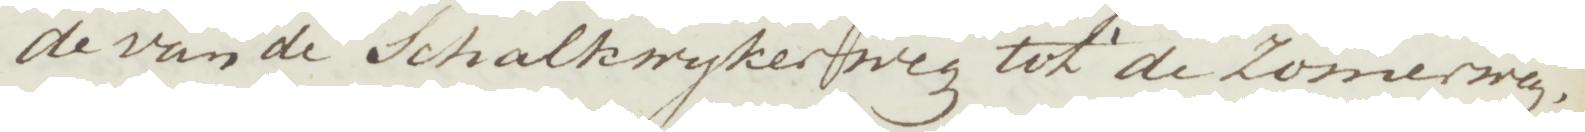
=de van de Schalkwykerweg tot de zomerweg,
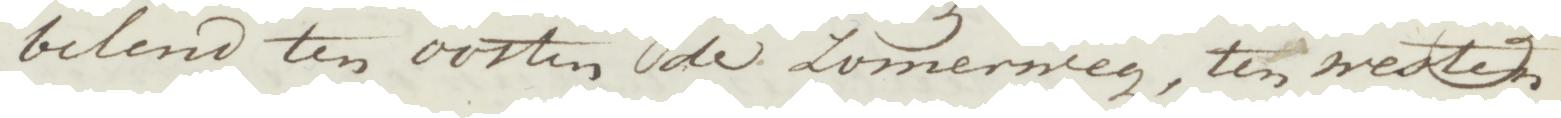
belend ten oosten de zomerweg, ten westen
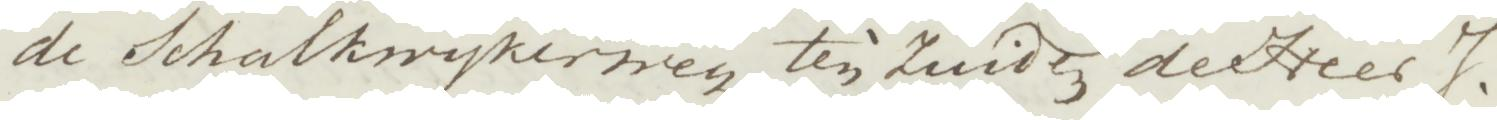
de Schalkwykerweg ten zuiden de Heer J.
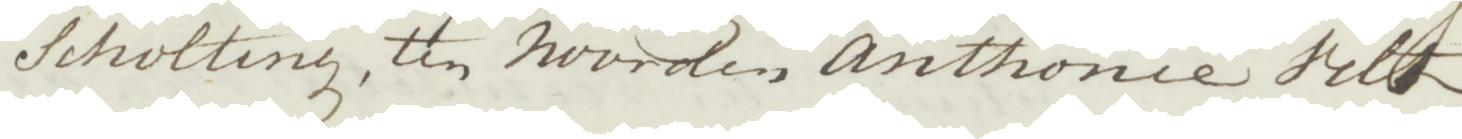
Scholting, ten noorden Anthonie Velt=
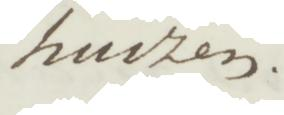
huizen.
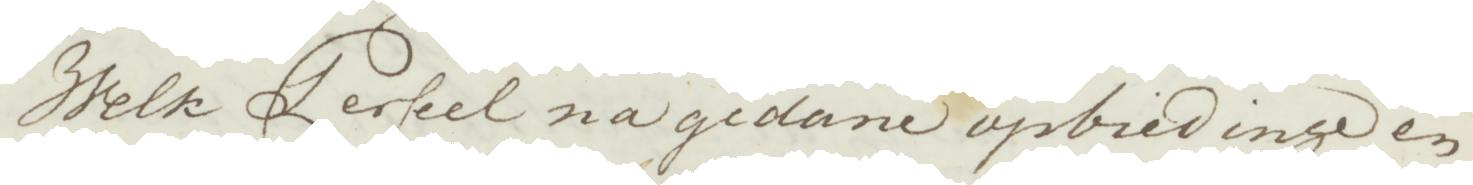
Welk Perceel na gedane opbiedinge en
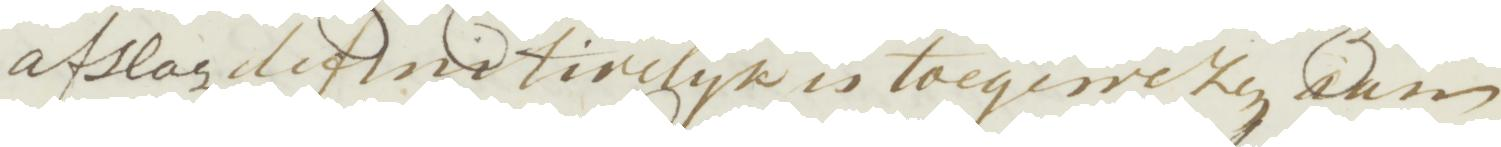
afslag definitivelyk is toegewezen aan
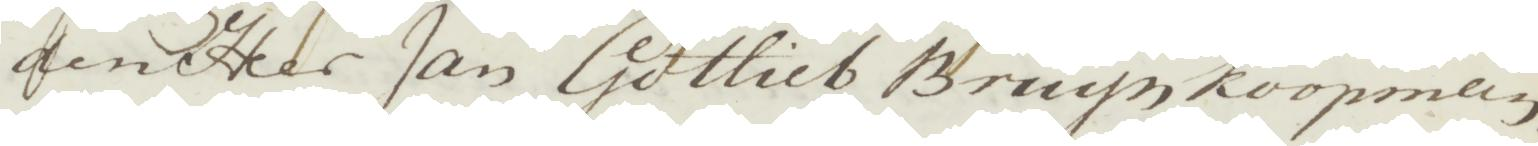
den Heer Jan Gotlieb Bruyn, koopman,
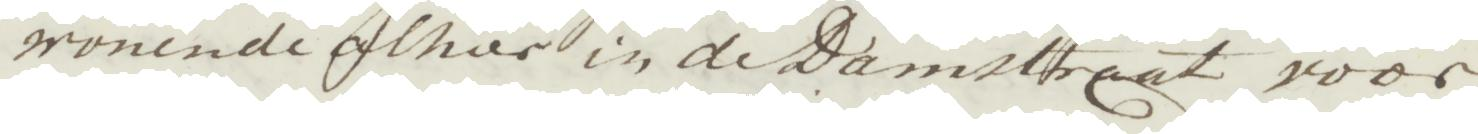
wonende alhier in de Damstraat voor
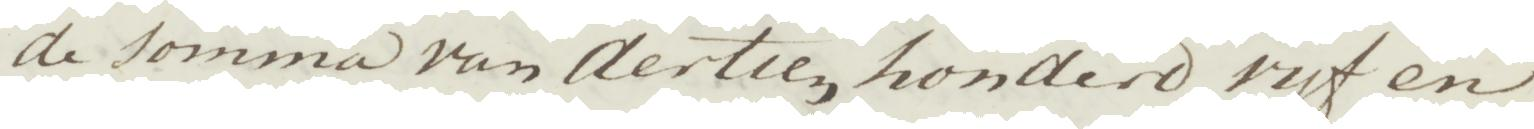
de somma van dertien honderd vyf en
